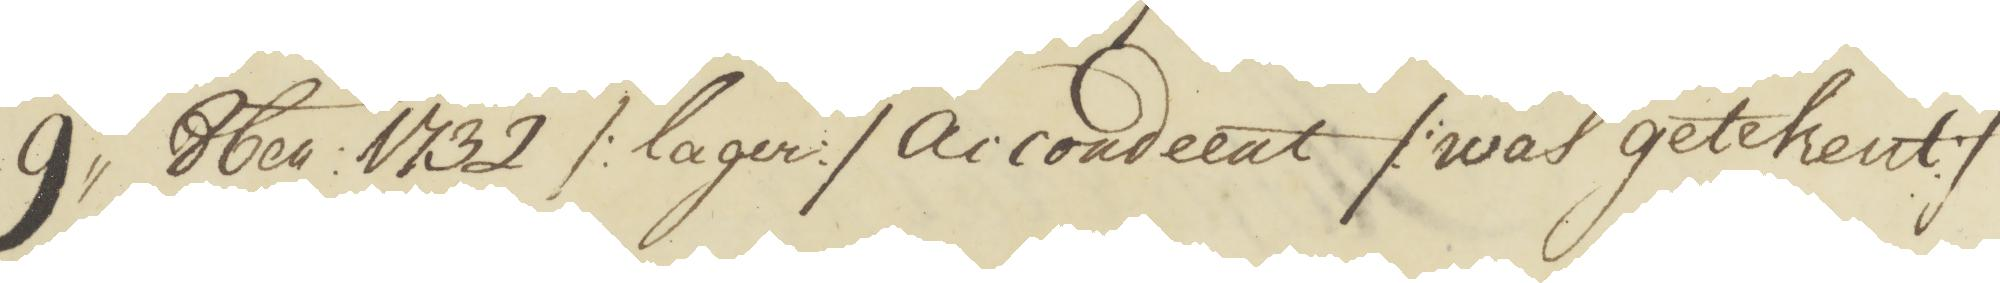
9„e 8ber: 1732 /: lager :/ accordeert /: was getekent :/
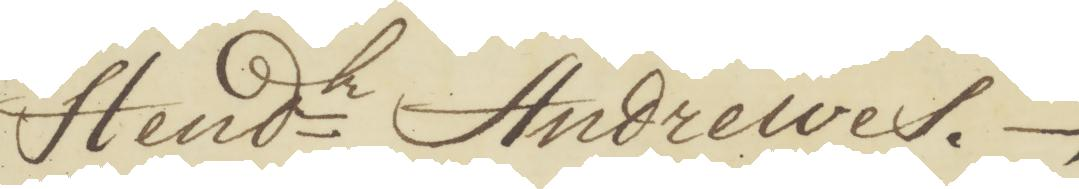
Hend=k Andrewes. —
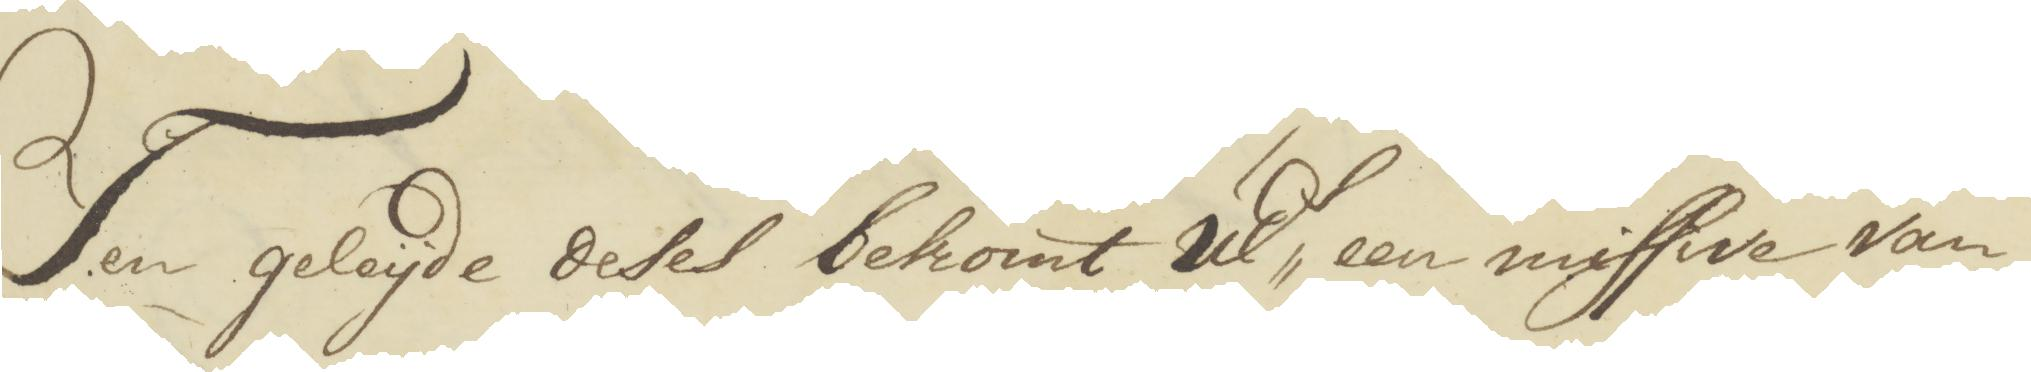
Ten geleijde deses bekomt uE„e een missive van
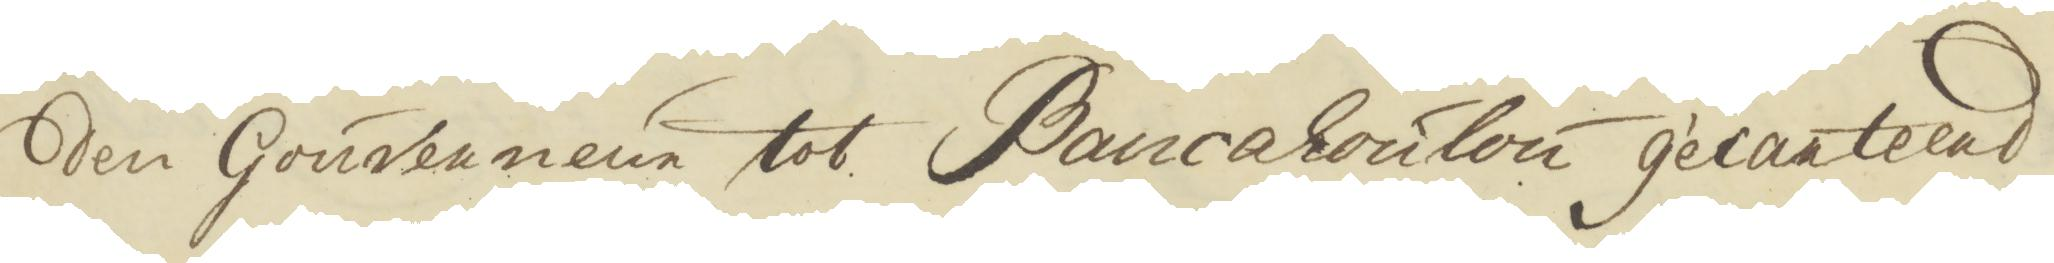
den Gouverneur tot Bancahoulou g'ecarteerd
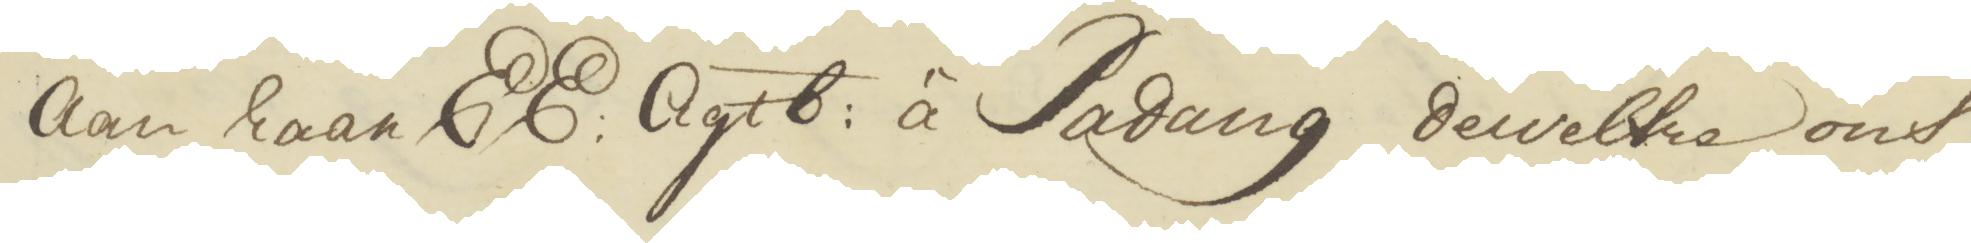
aan haar EE: Agtb: â Padang dewelke ons
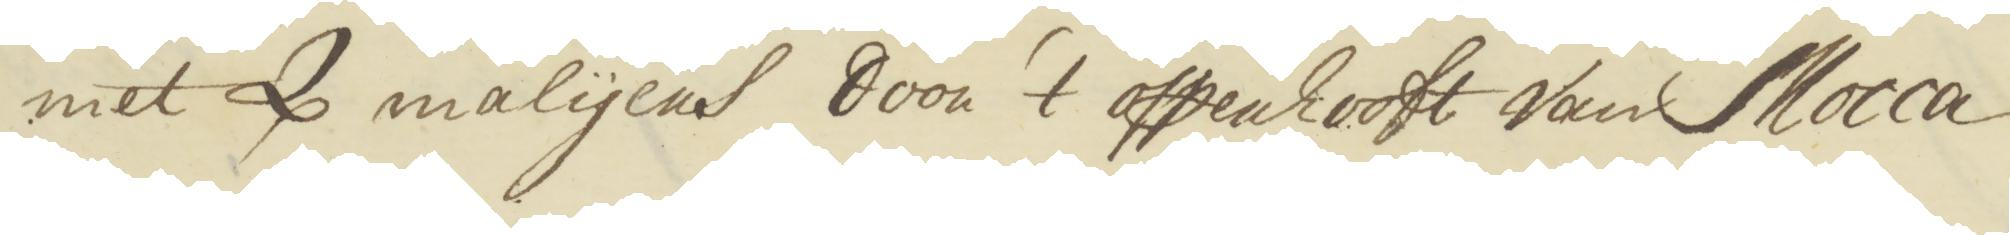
met 2 malijers door ’t opperhooft van Mocca
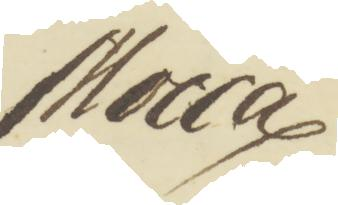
Mocca.
